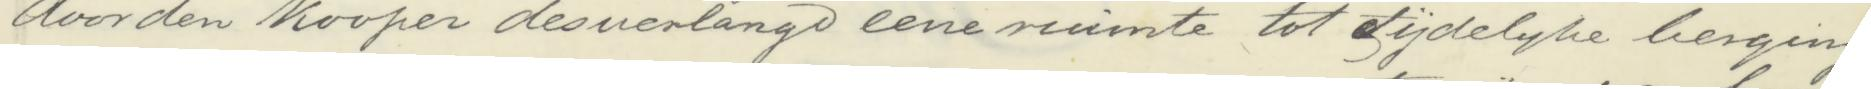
door den Kooper desverlangd eene ruimte tot tijdelyke berging
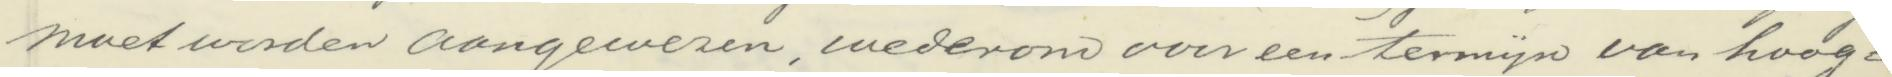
moet worden aangewezen, wederom voor een termijn van hoog=
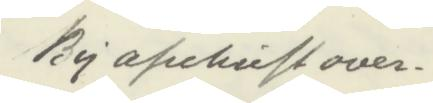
Bij afschrift over
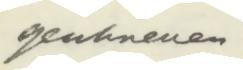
geschreven
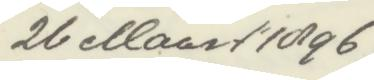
26 Maart 1896
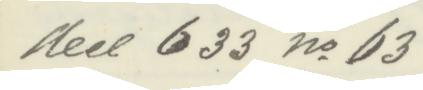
deel 633 n-o 63
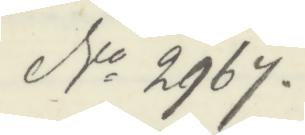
N=o 2967.
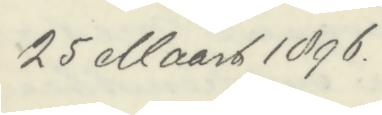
25 Maart 1896.
